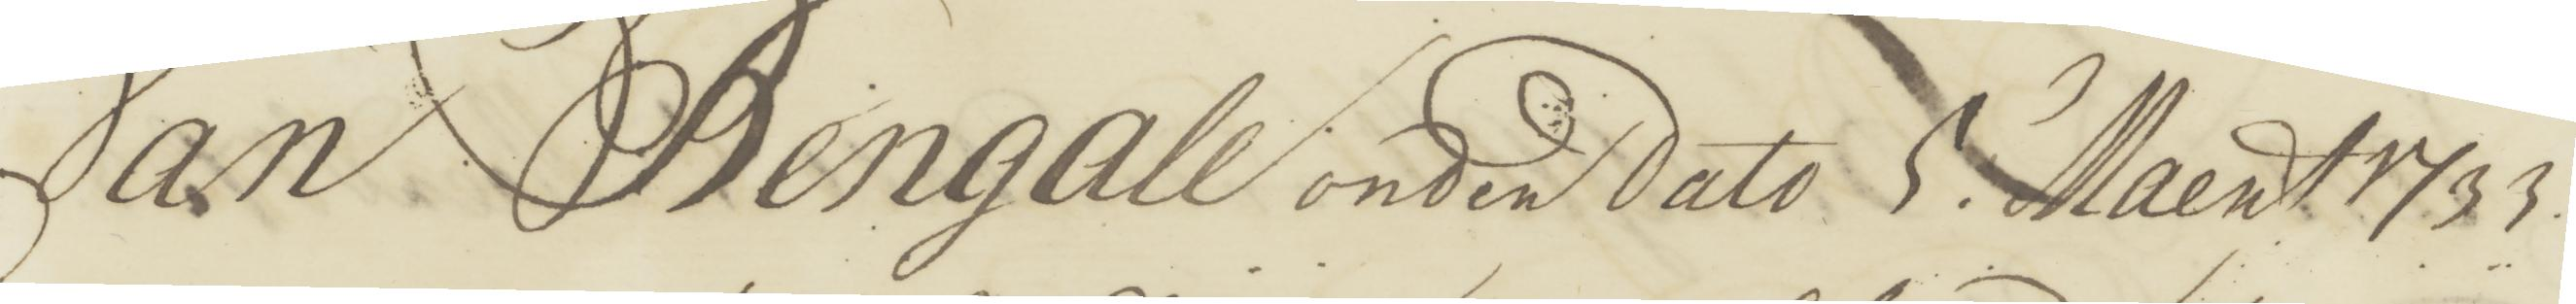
Van Bengale onder dato 5.' Maert: 1733.
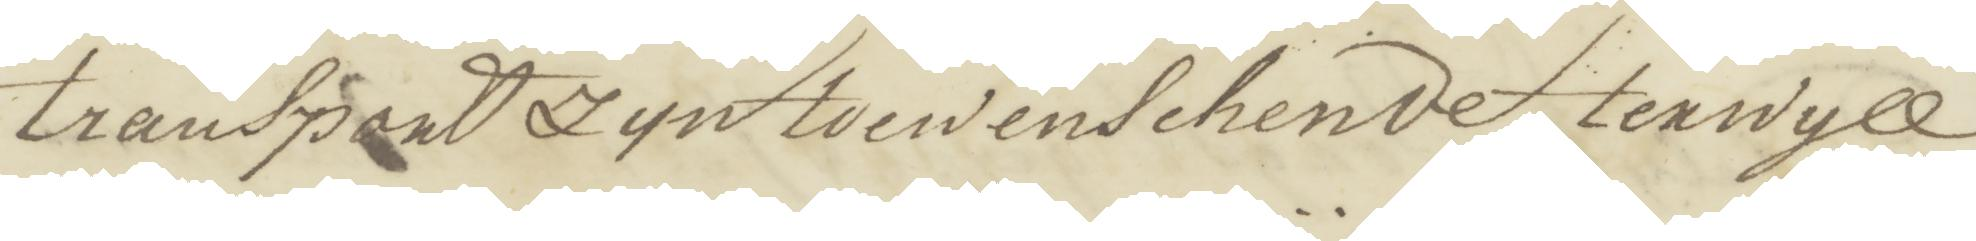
transport zijn toewenschende, terwyle
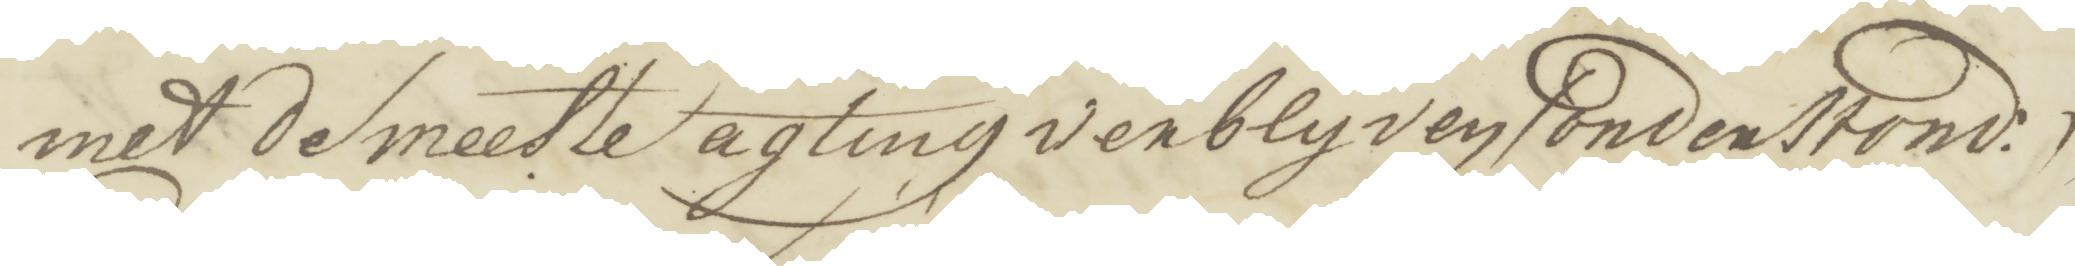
met de meeste agting verblijven /onder stond:/
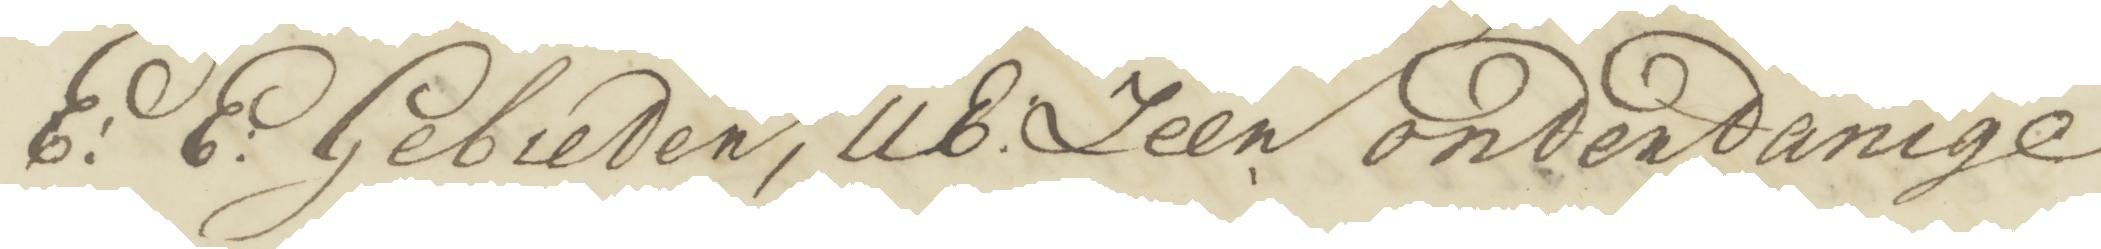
E: E: Gebieder, uE: Zeer onderdanige
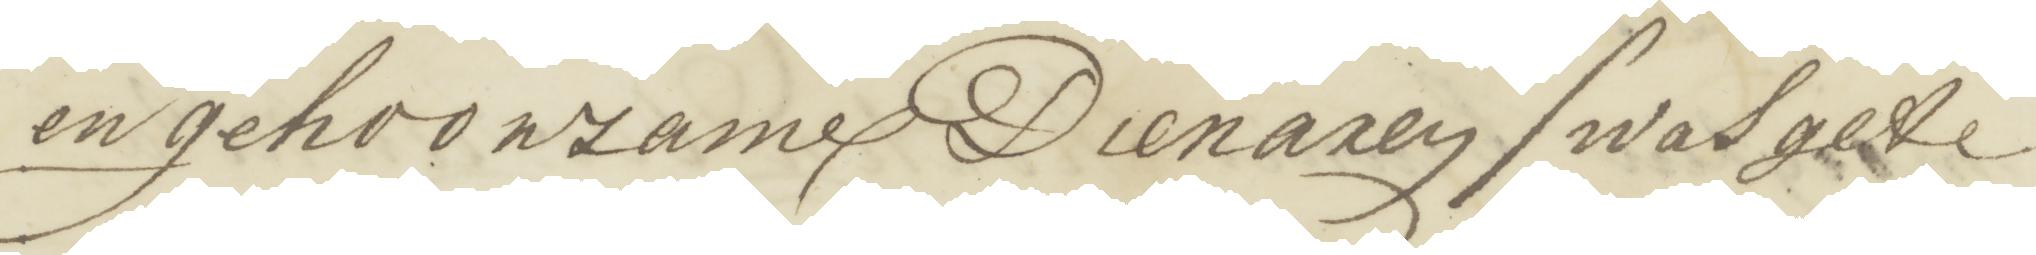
en gehoorzame Dienaren / was gete
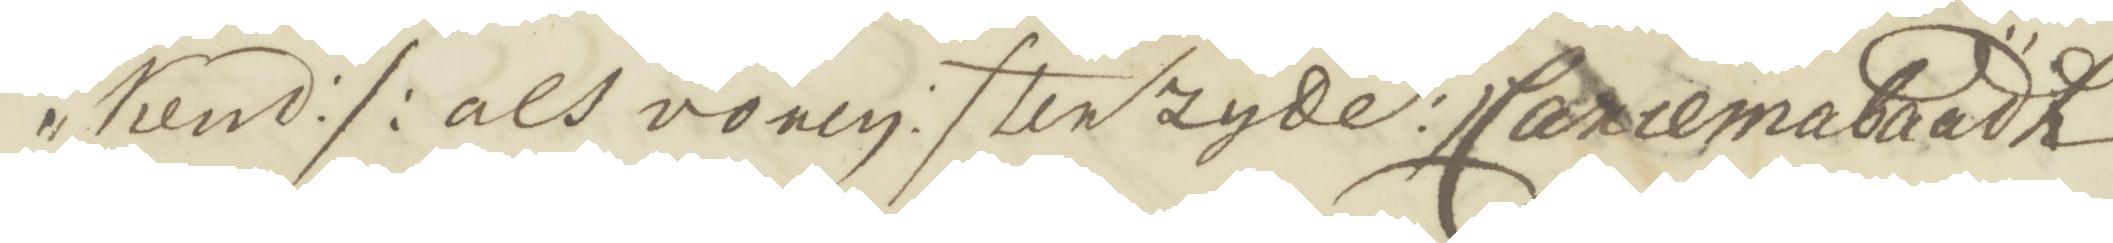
„kend: /: als voren: / ter zijde: / Cariemabaadh
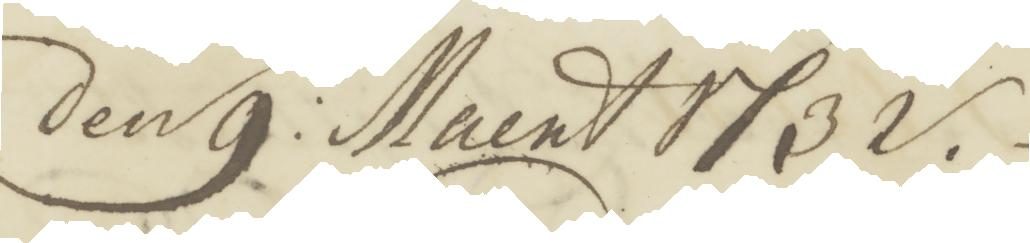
den 9: Maert 1732.
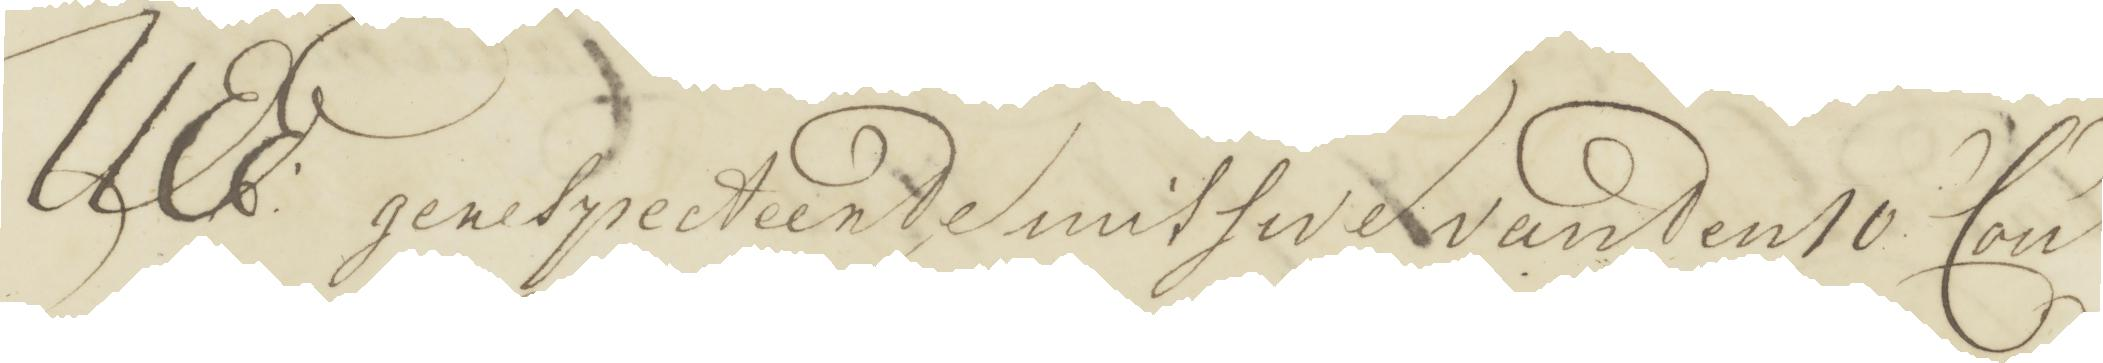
UEE: gerespecteerde missive van den 10: Cou
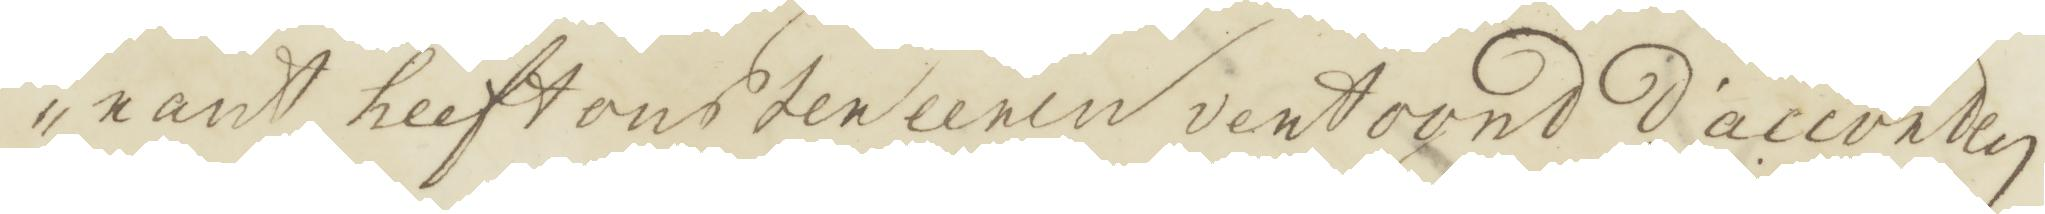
„rant heeft ons ter eeren vertoond d’accorden
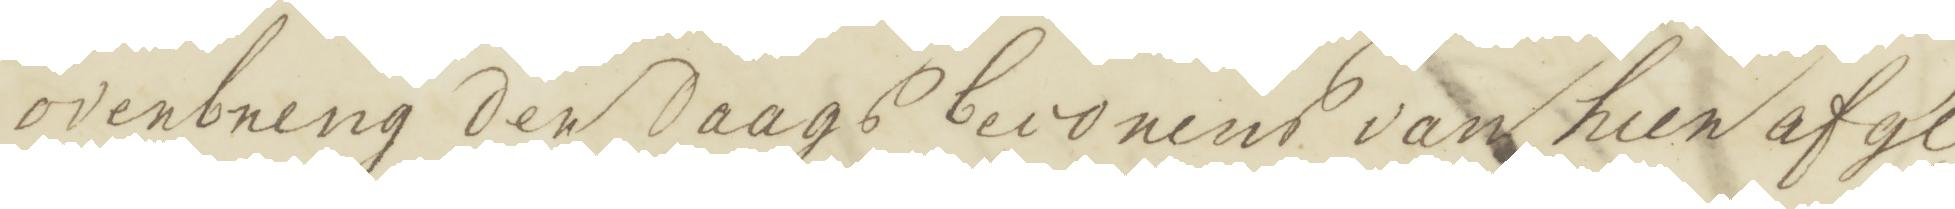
overbreng der daags bevorens van hier afge
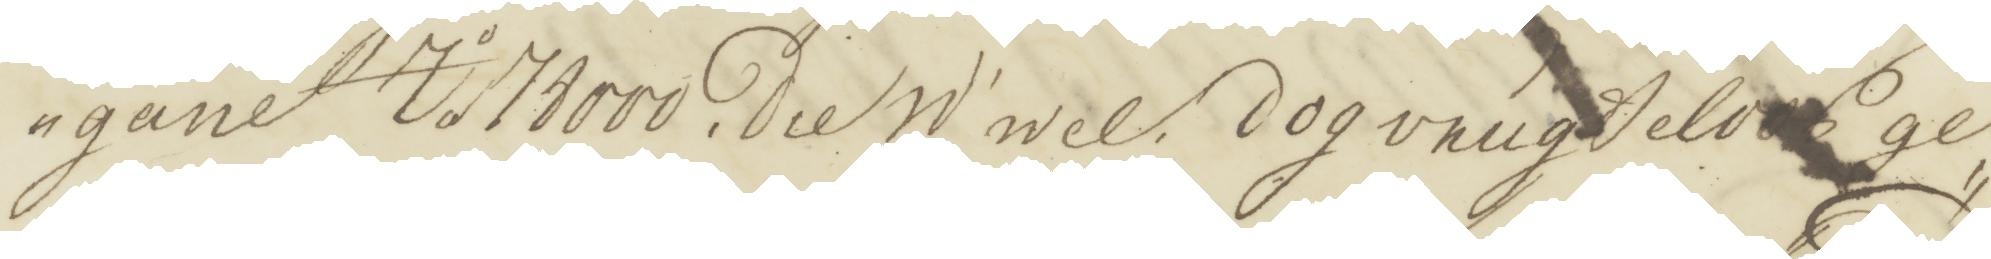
„gane R o/a 78000 die W' wel dog vrugteloos ge„
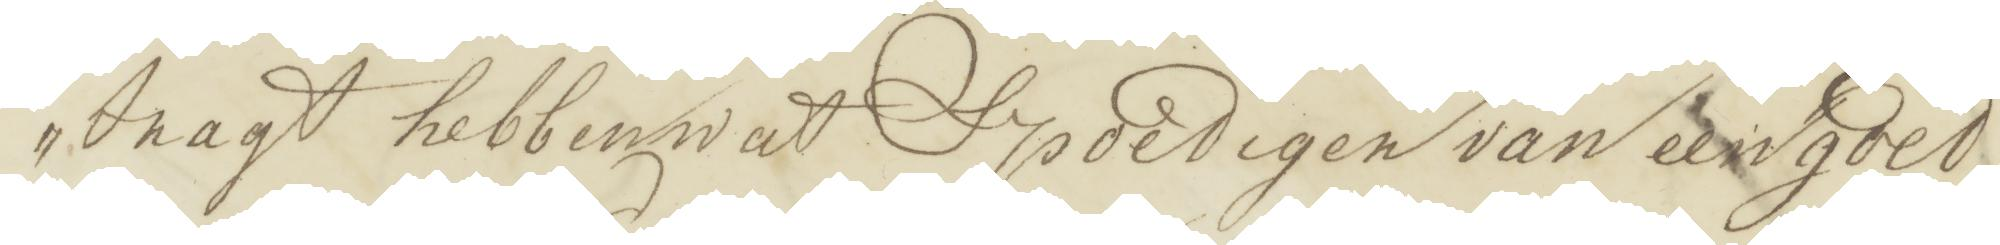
„tragt hebben wat Spoediger van een goed
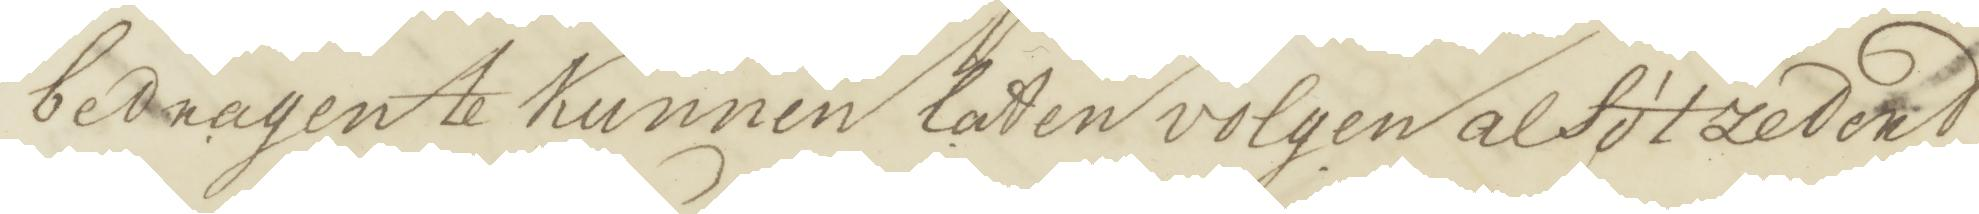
bedragen te kunnen laten volgen also 't zederd
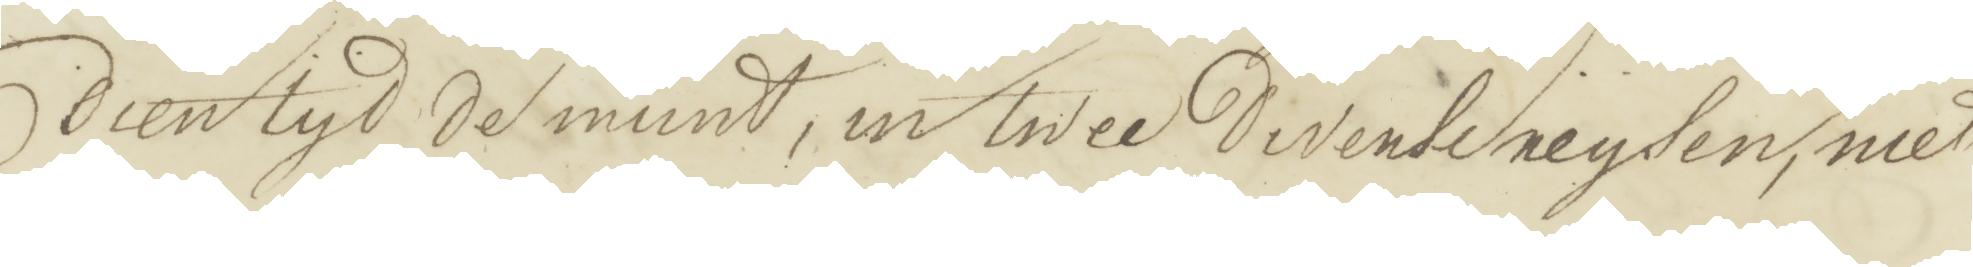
dien tijd de munt, in twee diverse reijsen, niet
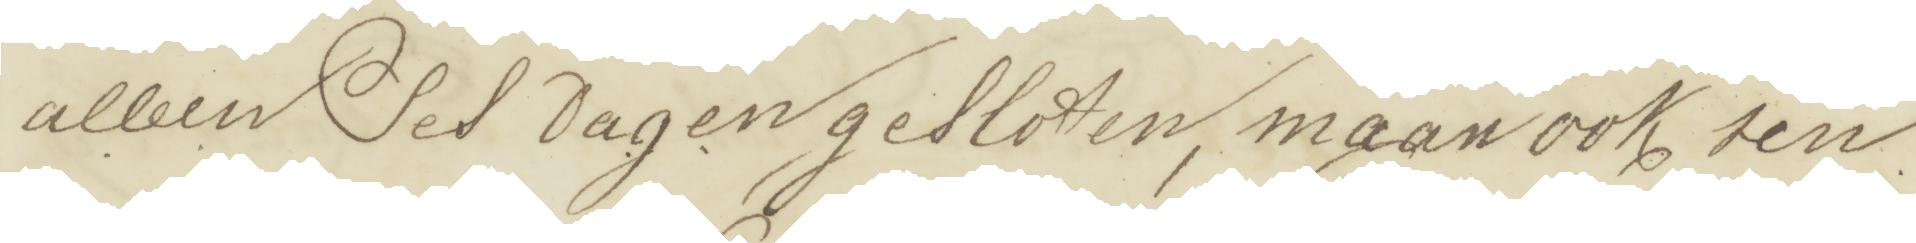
alleen Ses dagen gesloten, maar ook ten
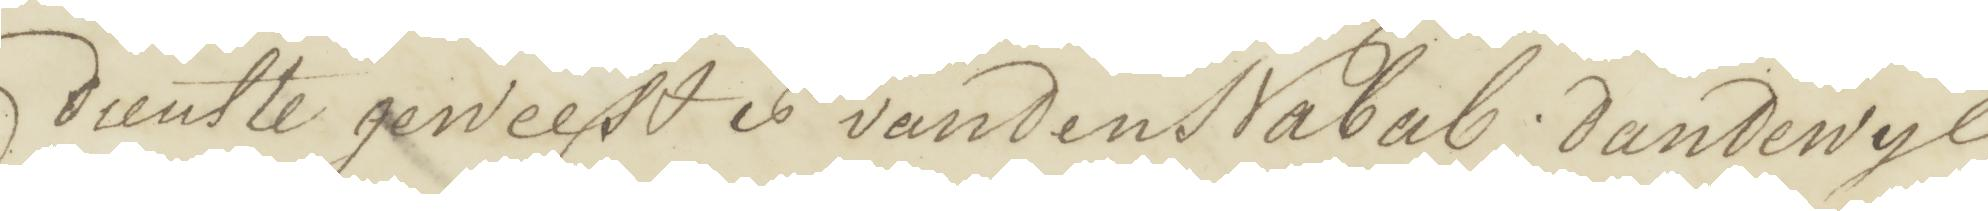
dienste geweest is van den Nabab; dan dewijl
